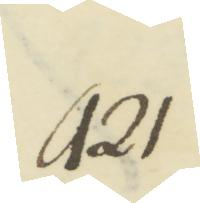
421
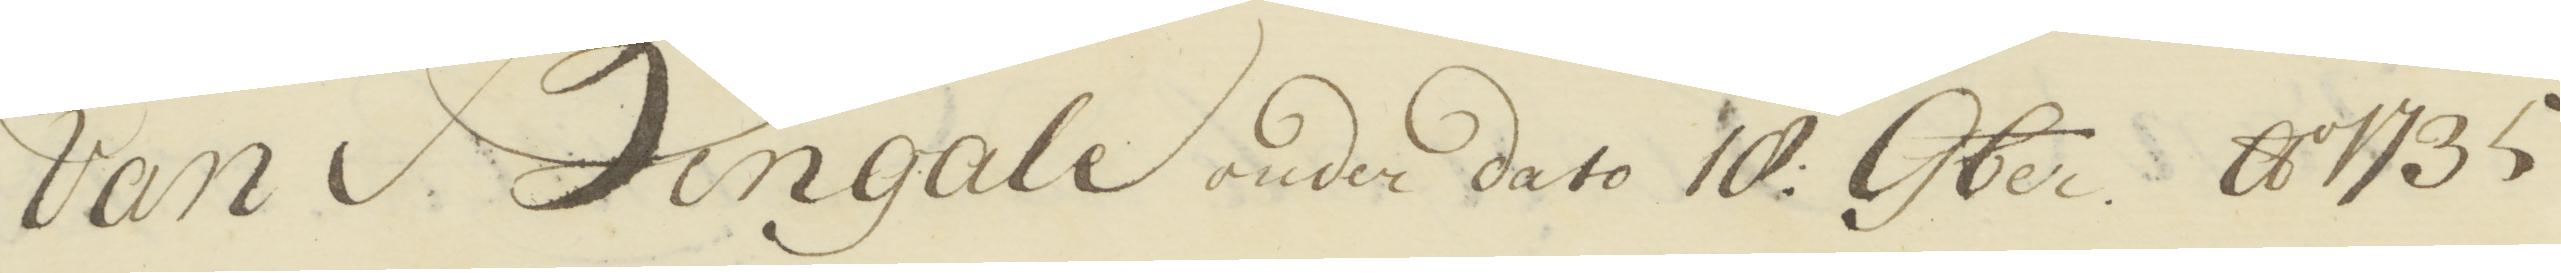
Van Bengale onder dato 18:' 9ber: A:o 1735
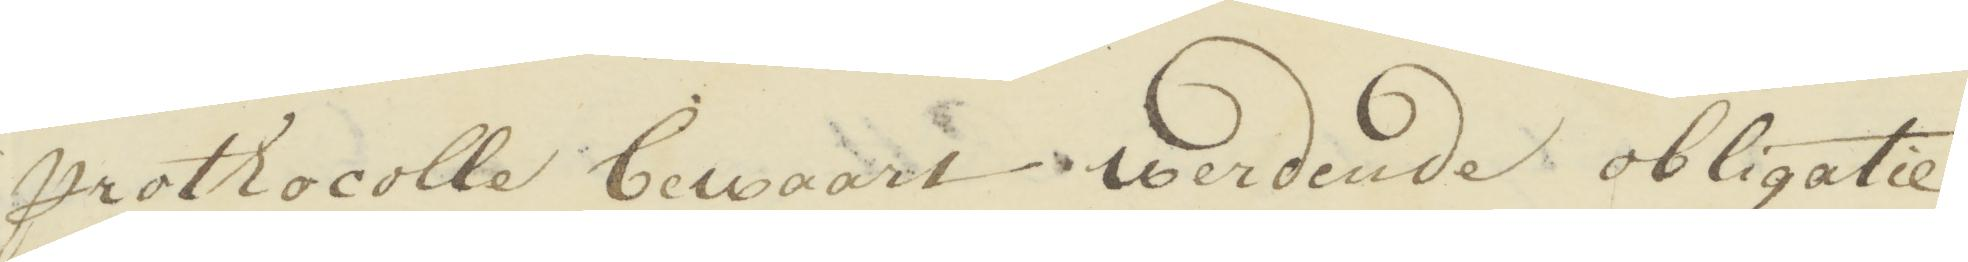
prothocolle bewaart werdende obligatie
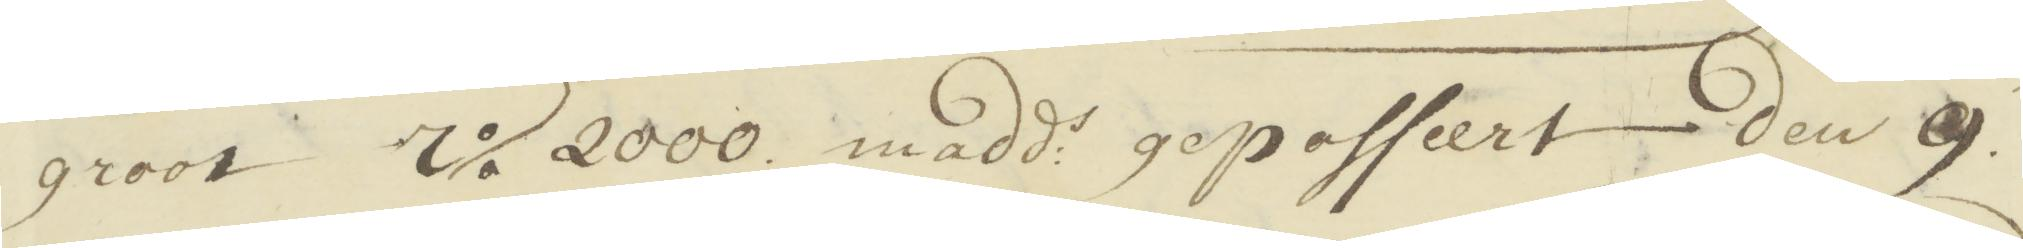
groot r:o/a 2000. madd:s gepasseert den 9'.
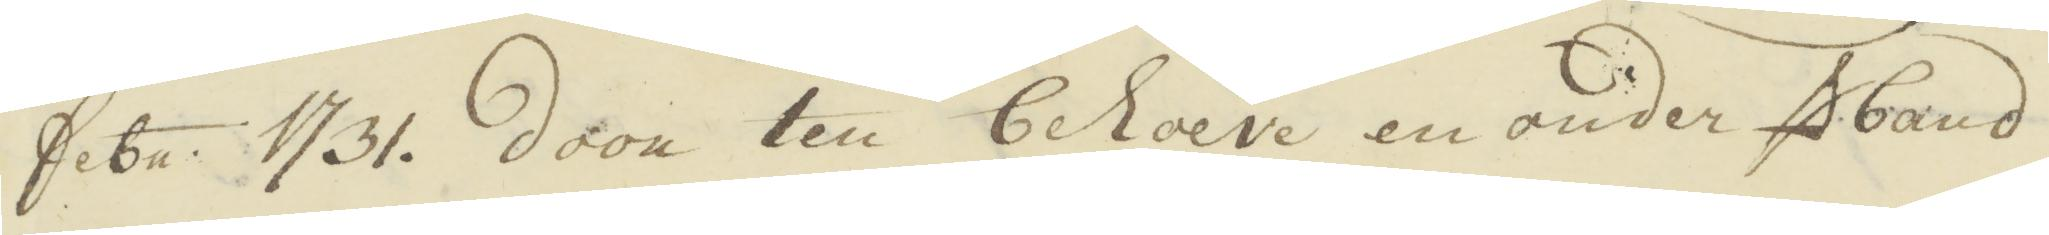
febr: 1731. door ten behoeve en onder verband
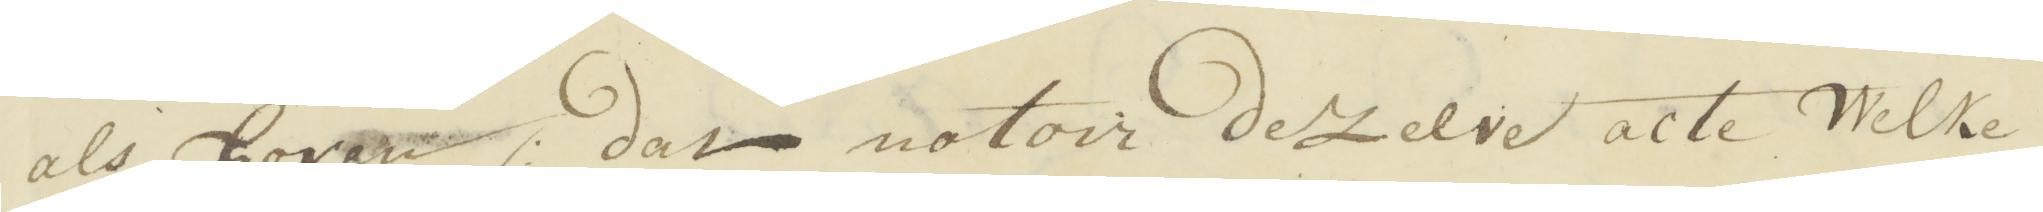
als boven (: dat notoir dezelve acte welke
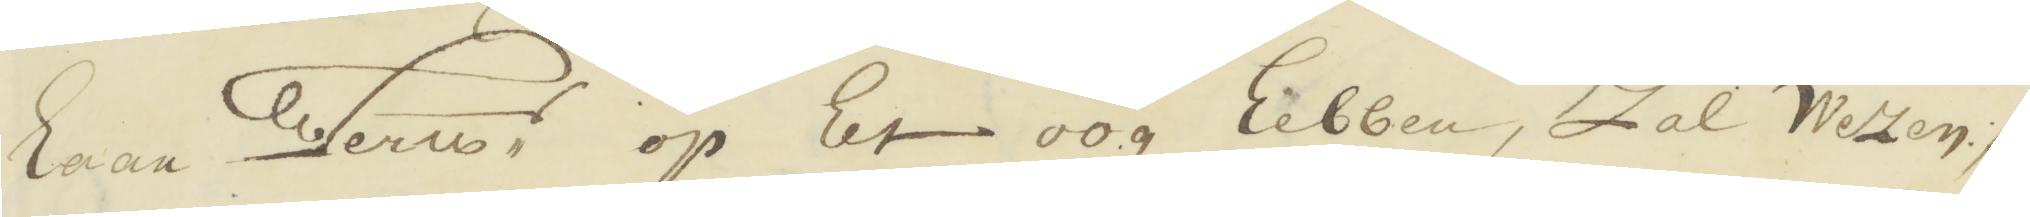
haar Eerw:s op het oog hebben, Zal wezen:/
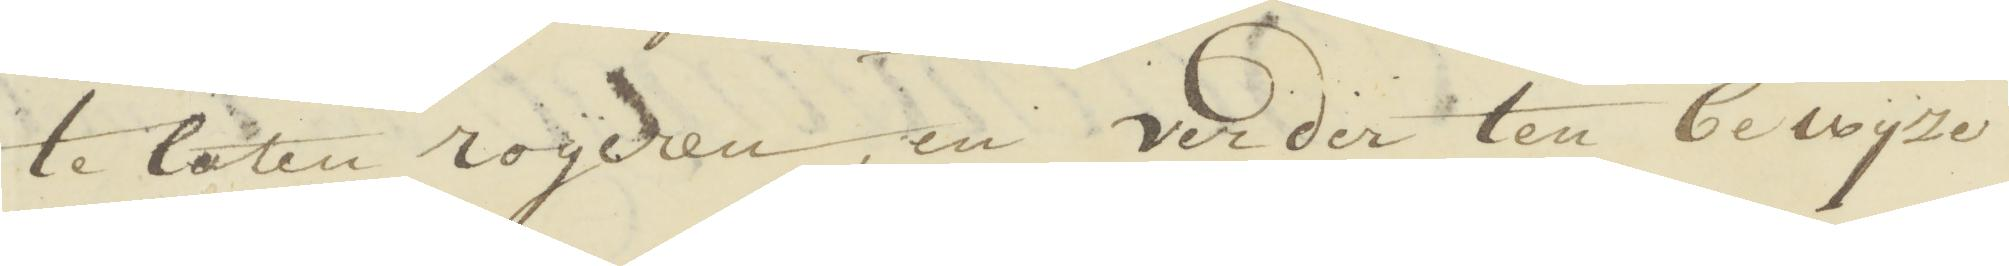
te laten roijeren, en verder ten bewijze
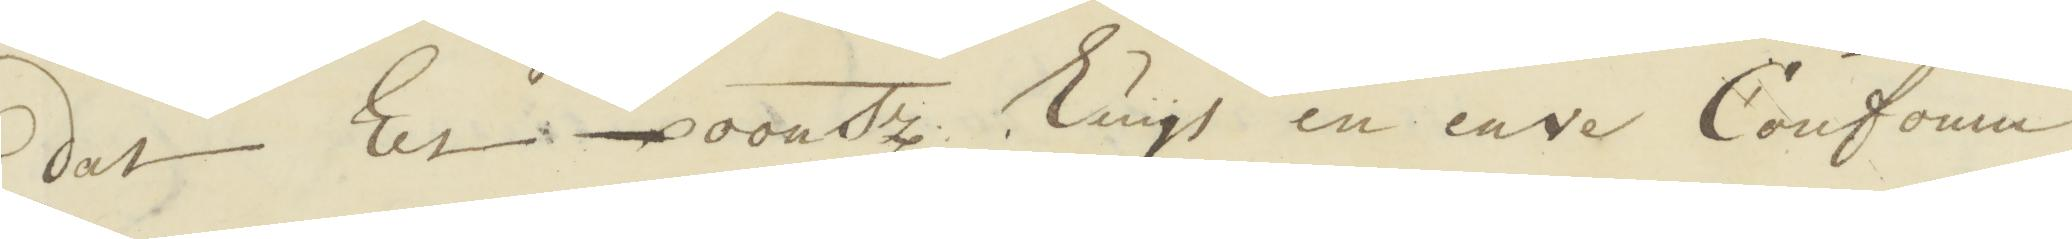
dat het voorsz: huijs en erve Conform
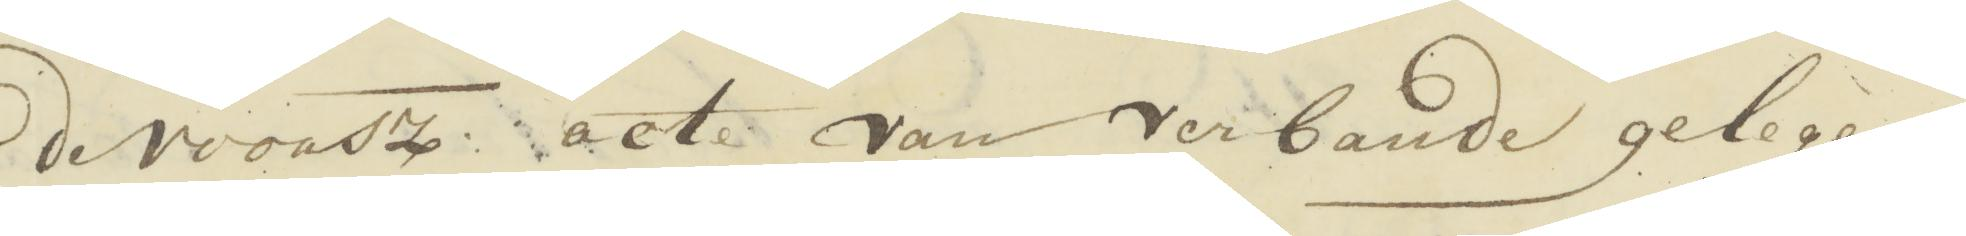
de voorsz:acte van verbande gelegen
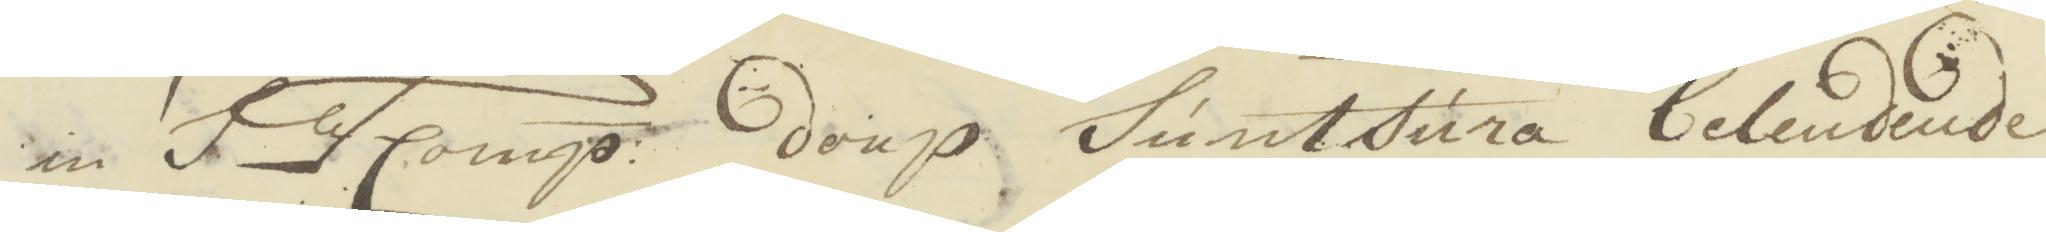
in 'S EComp: dorp Suntsura belendende
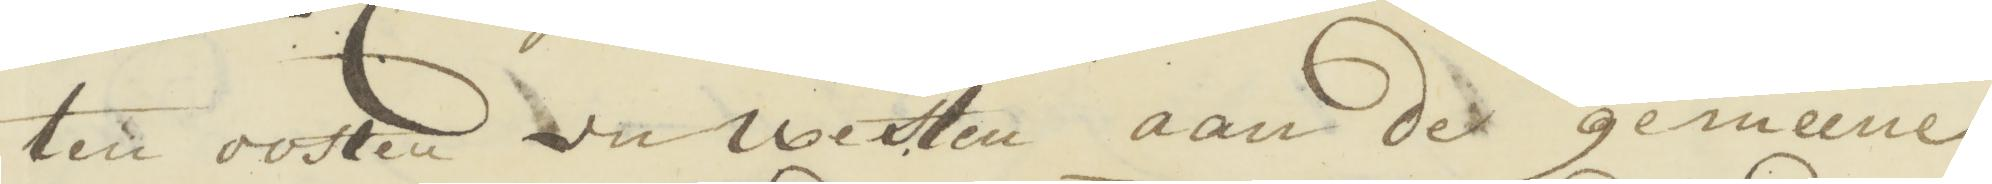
ten oosten en westen aan de gemeene
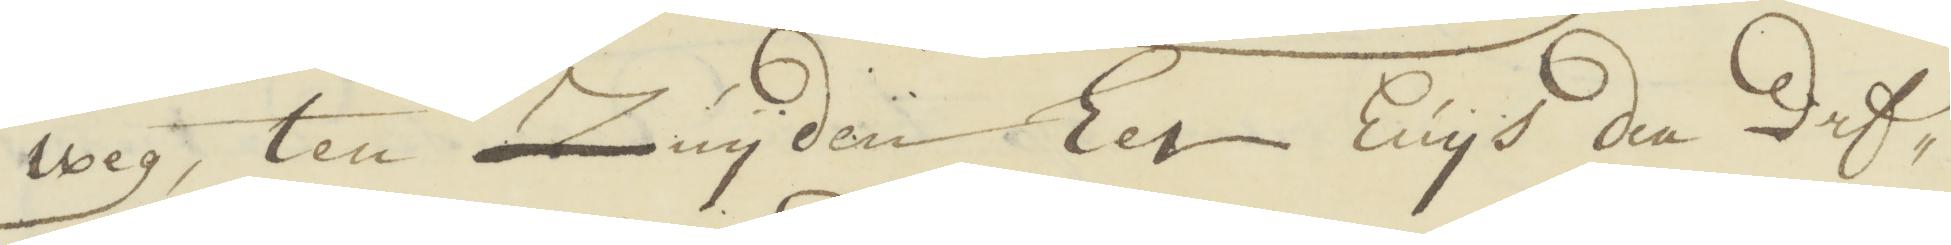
weg, ten Zuijden het huijs den Erf„
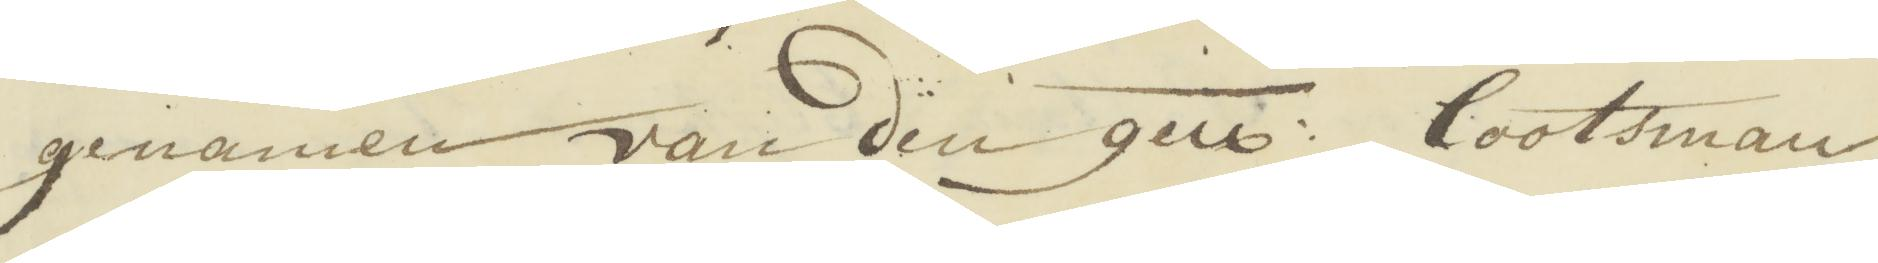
genamen van den gew: lootsman
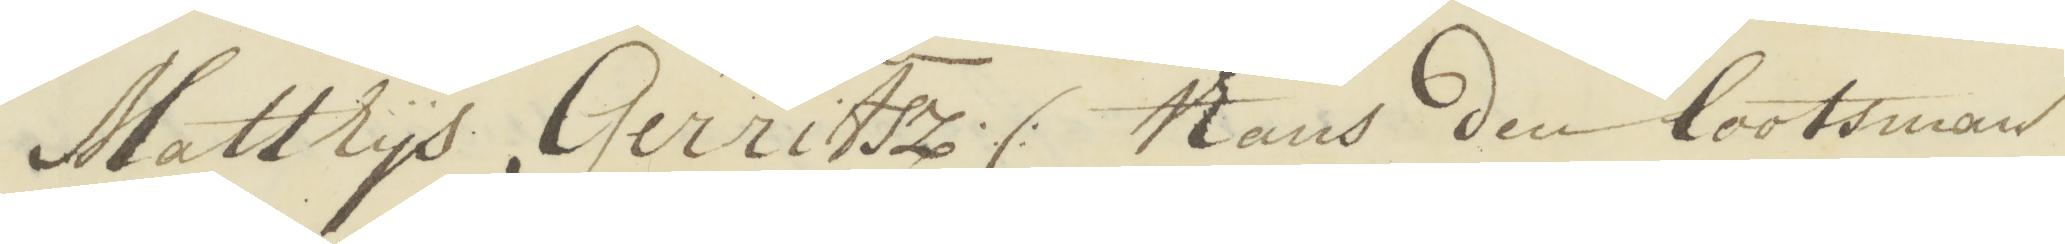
Matthijs Gerritsz: (:thans den lootsman
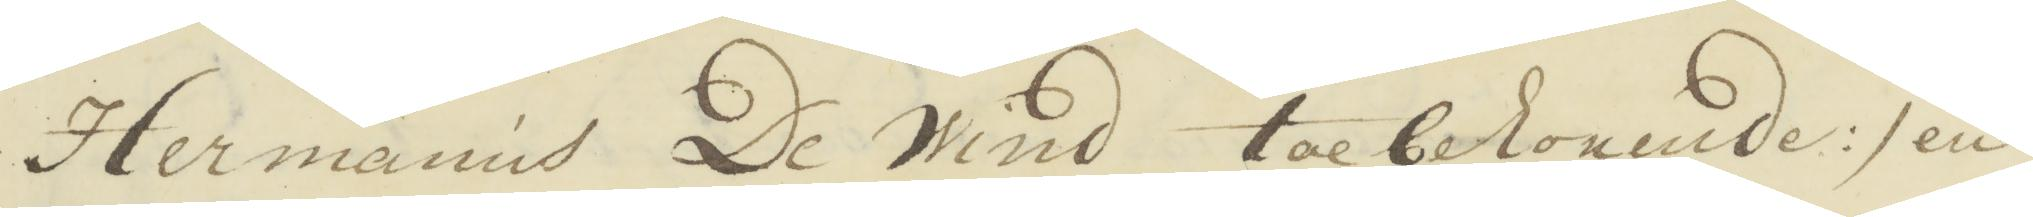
Hermanus De wind toebehorende:) en
